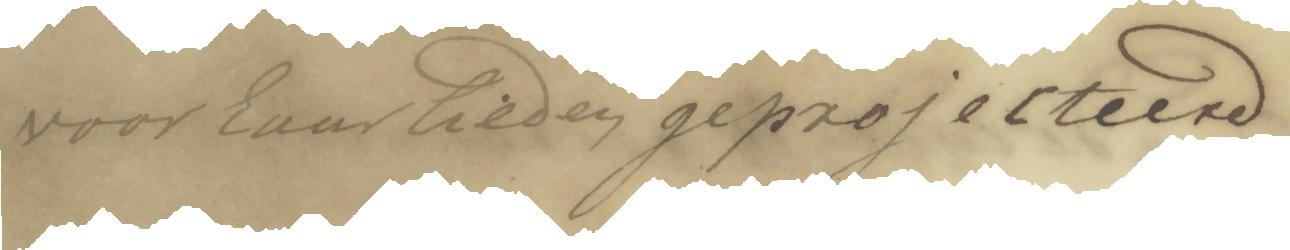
voor haar lieden geprojecteerd
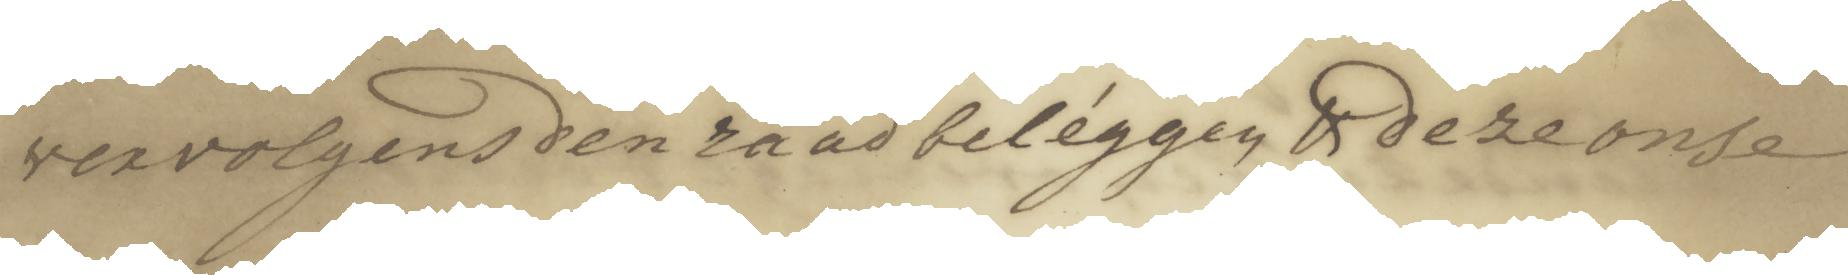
vervolgens den raad beleggen & deze onse
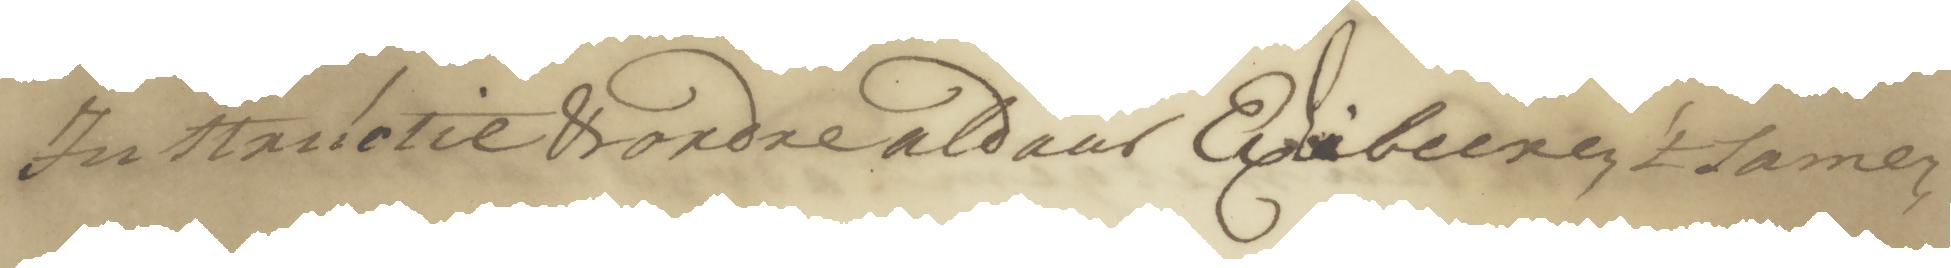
Instructie & ordre aldaar Exhibeeren ’t samen
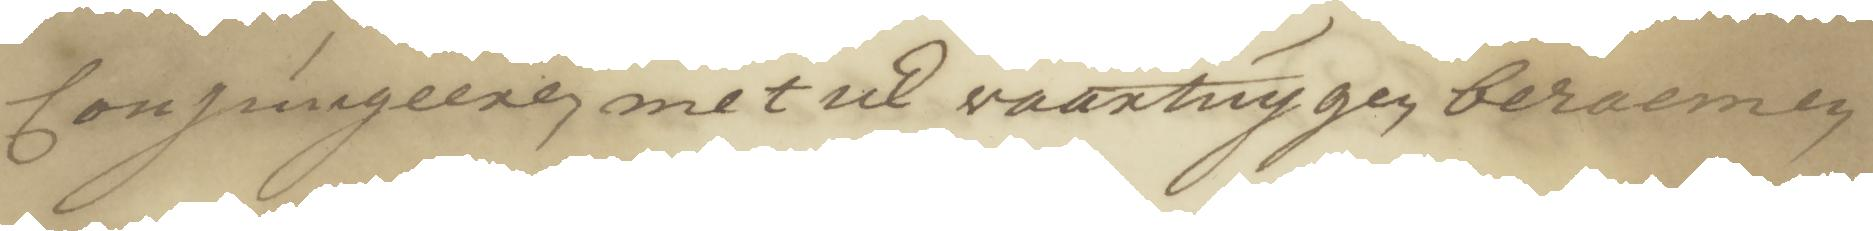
Conjungeeren met uE vaartuygen beroemen
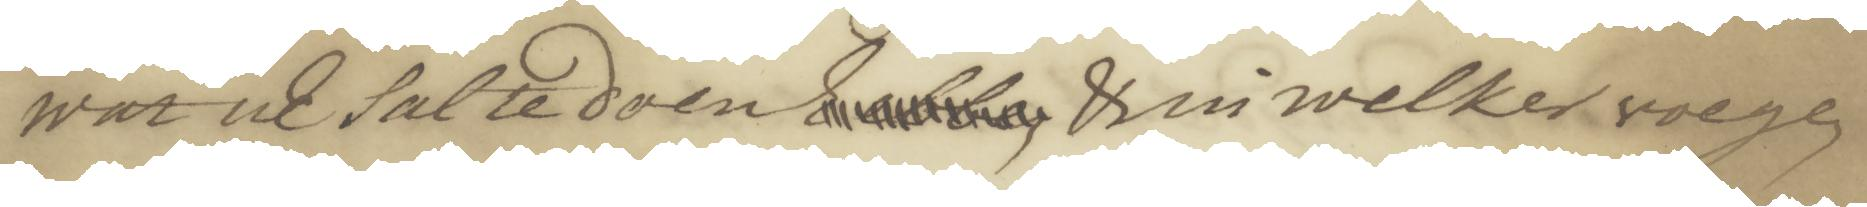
wat uE salte doen hebben & in welker voegen
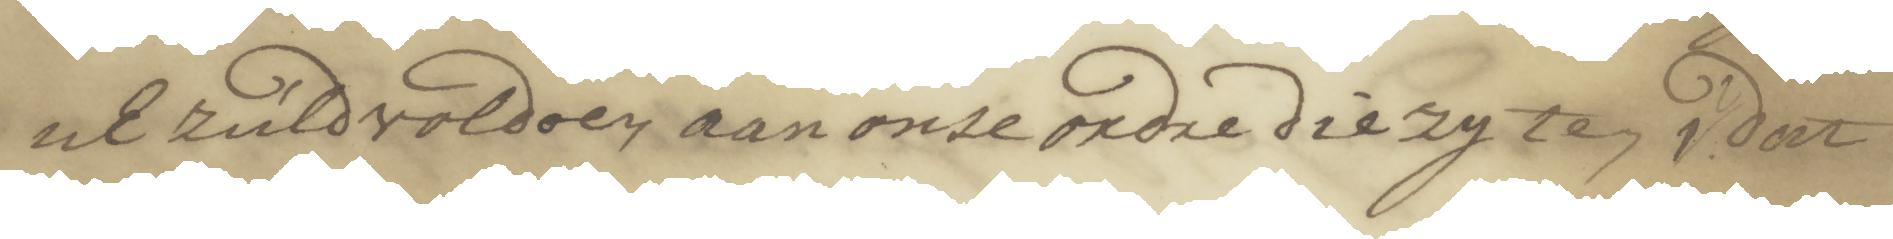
uE zuld voldoen aan onse ordre die zy ten 1:' dat
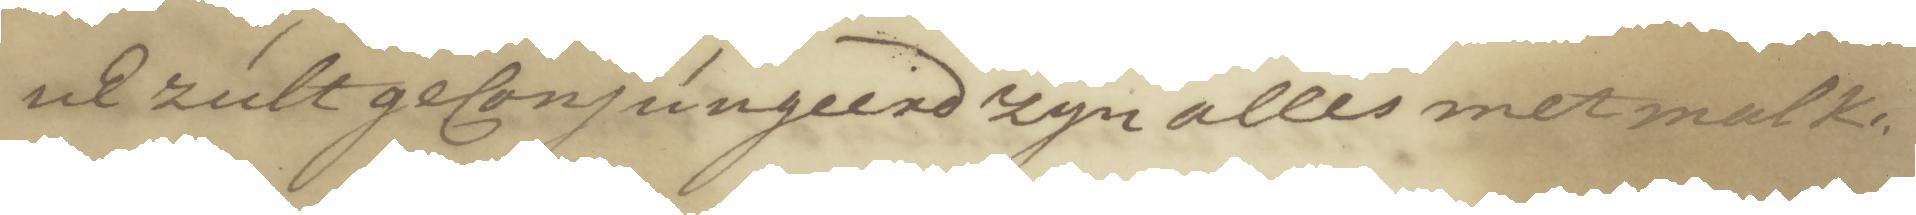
uE zult geconjungeerd zijn alles met malk„
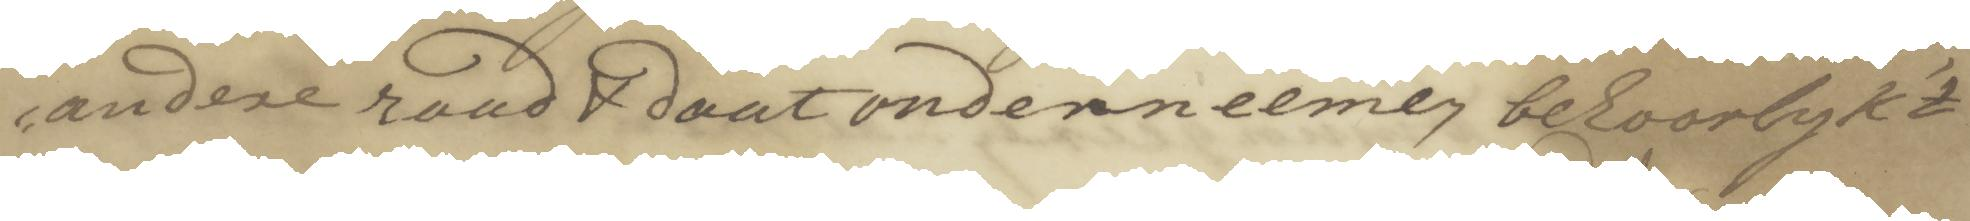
„andere raad & daat onderneemen behoorlyk't
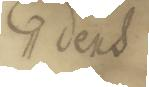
ders
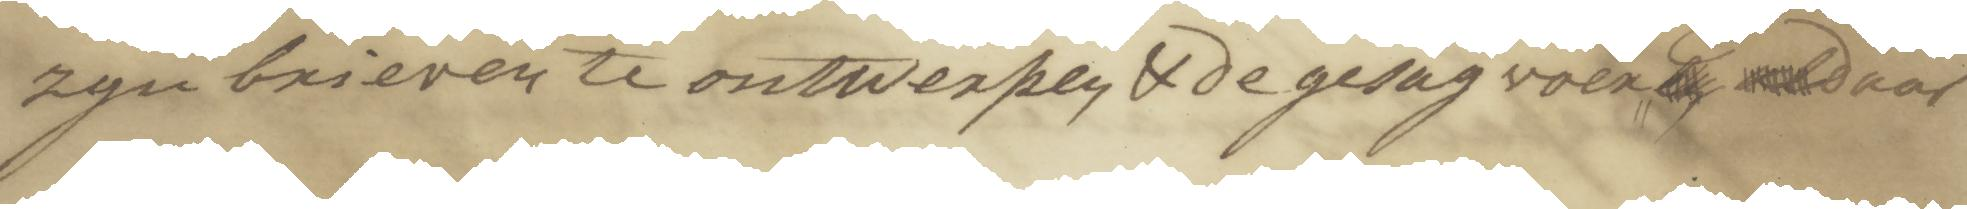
zyn brieven te ontwerpen & de gesag voer„ by aldaar
